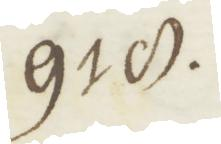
918.
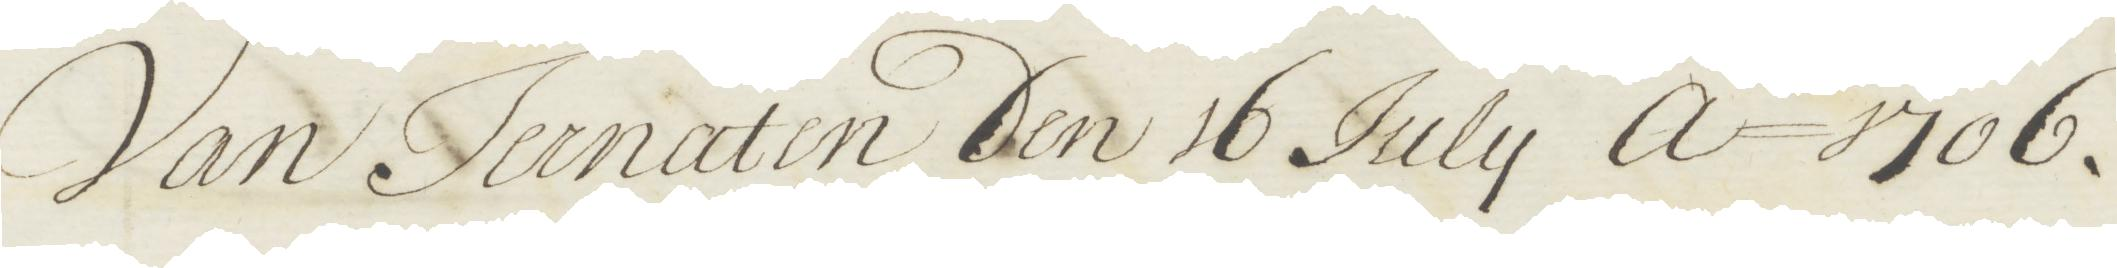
Van Ternaten den 16 Iuly A=o 1706.
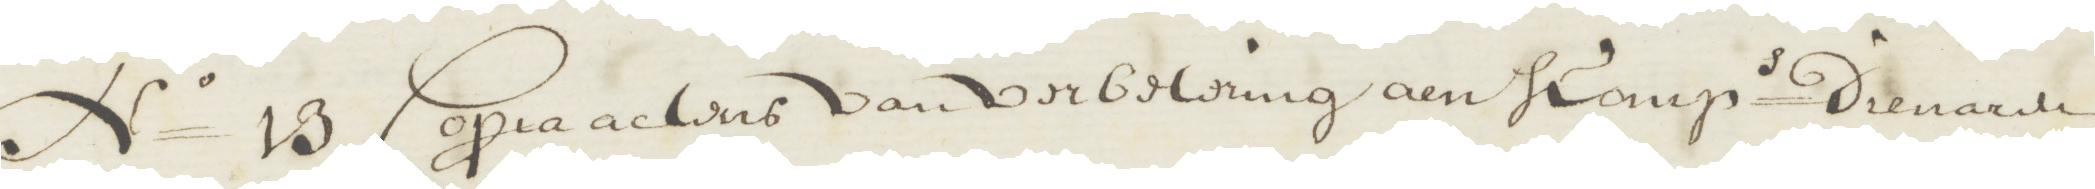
N=o 13 Copia actens van verbetering aen scomp=s dienaren
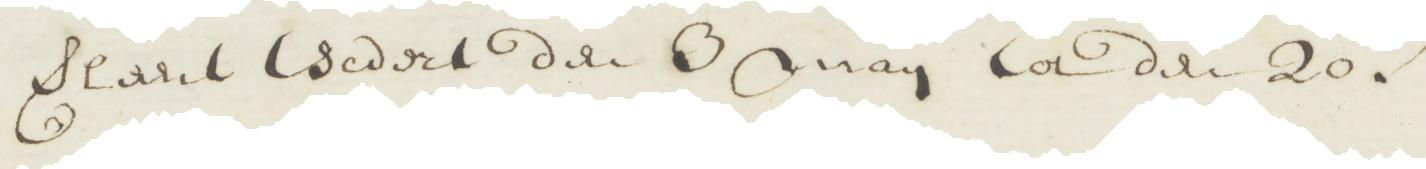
verleent tsedert den 3 may tot den 20.en
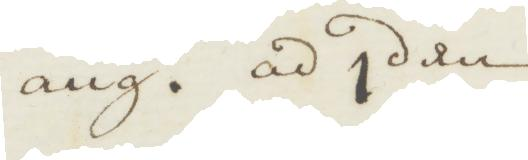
aug.o ad jdem
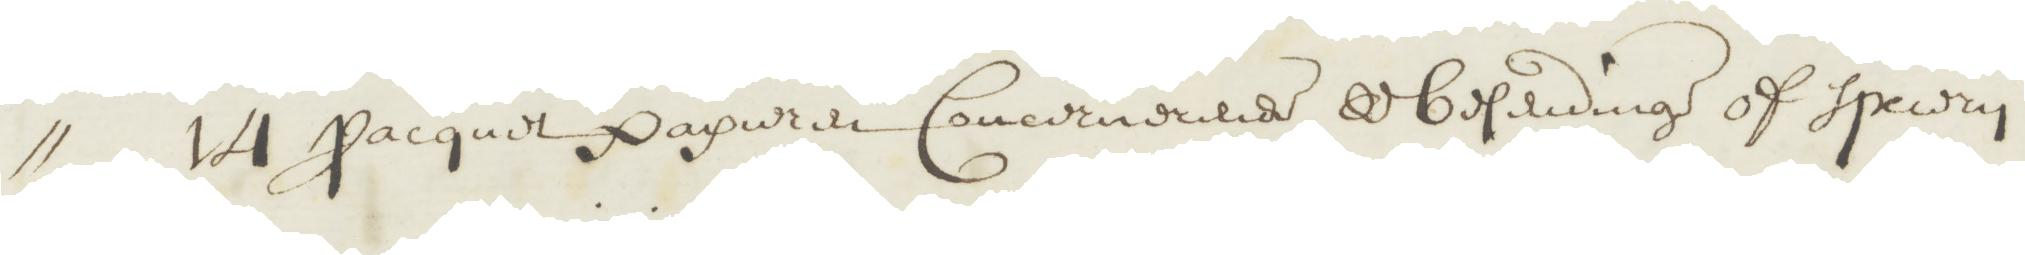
„ 14 pacquet papieren Concernerende de besendinge of specerij
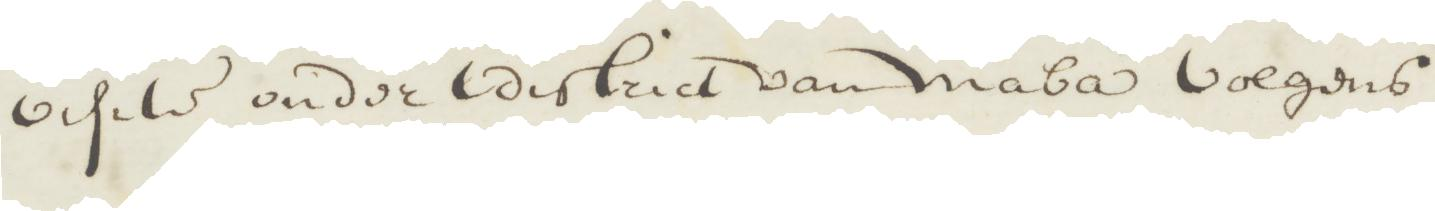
visite onder t district van maba volgens
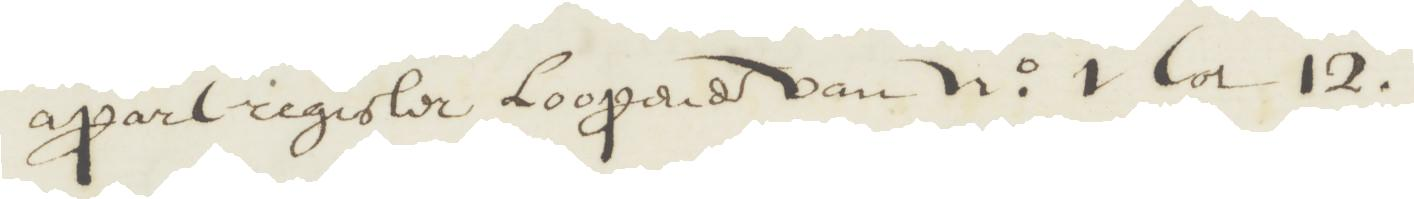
apart register loopende van n.o 1 tot 12.
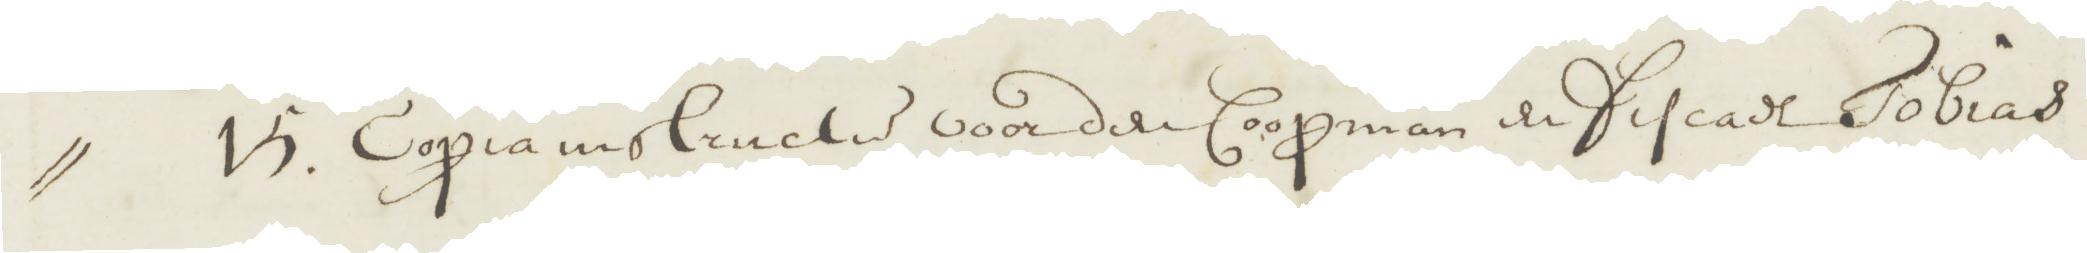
„ 15. Copia instructie voor den Coopman en fiscael Tobias
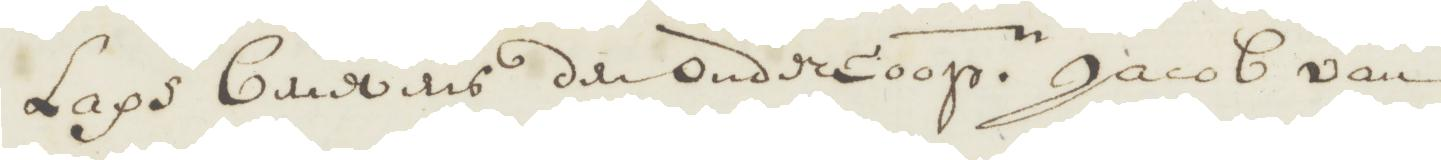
Laps benevens den ondercoop.n Jacob van
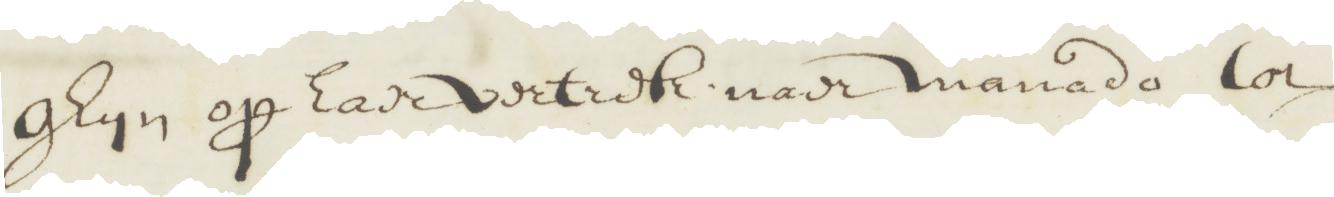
Ghyn op haer vertrek naer manado tot
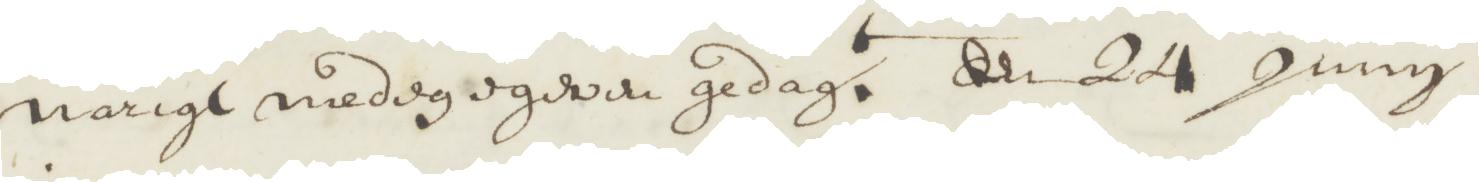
narigt mede gegeven gedag.t den 24 Junij
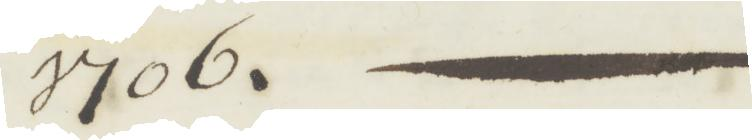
1706. —
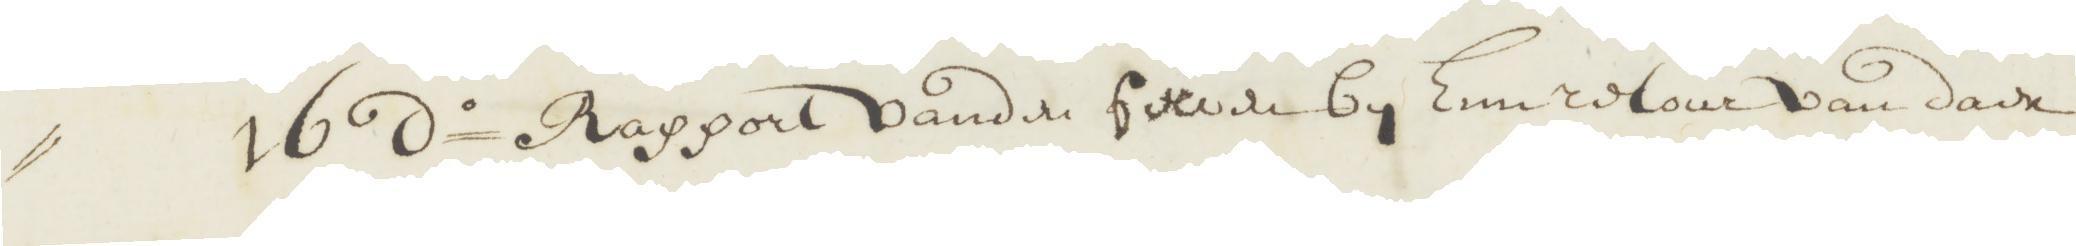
„ 16 d=o Rapport vanden selven by hun retour van daer
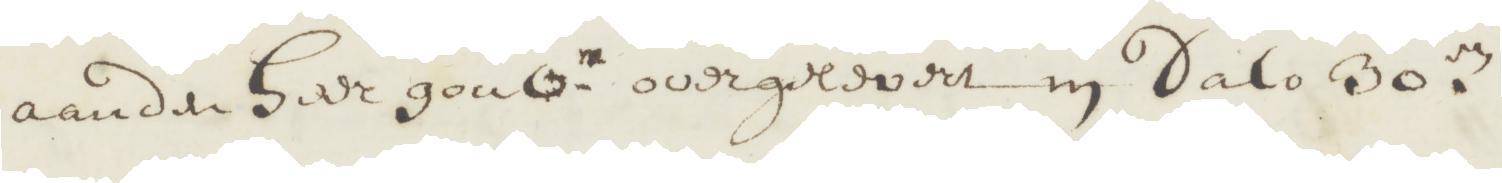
aan den heer gouv-r overgelevert in dato 30.en
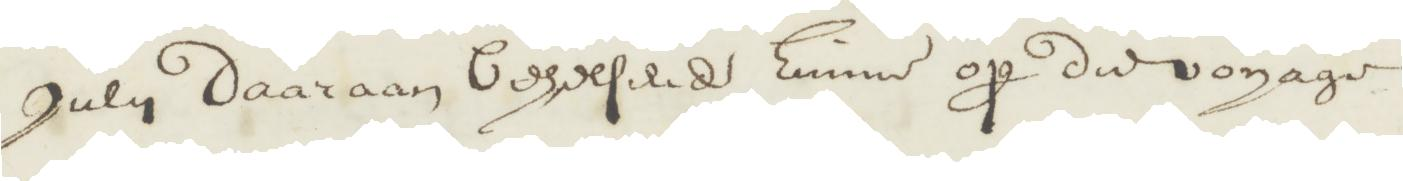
July daaraan behelsende hunne op die voyage
